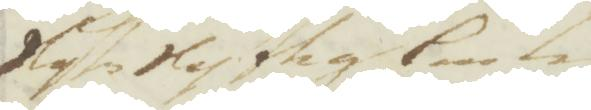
Vijf Vijftig Cents
